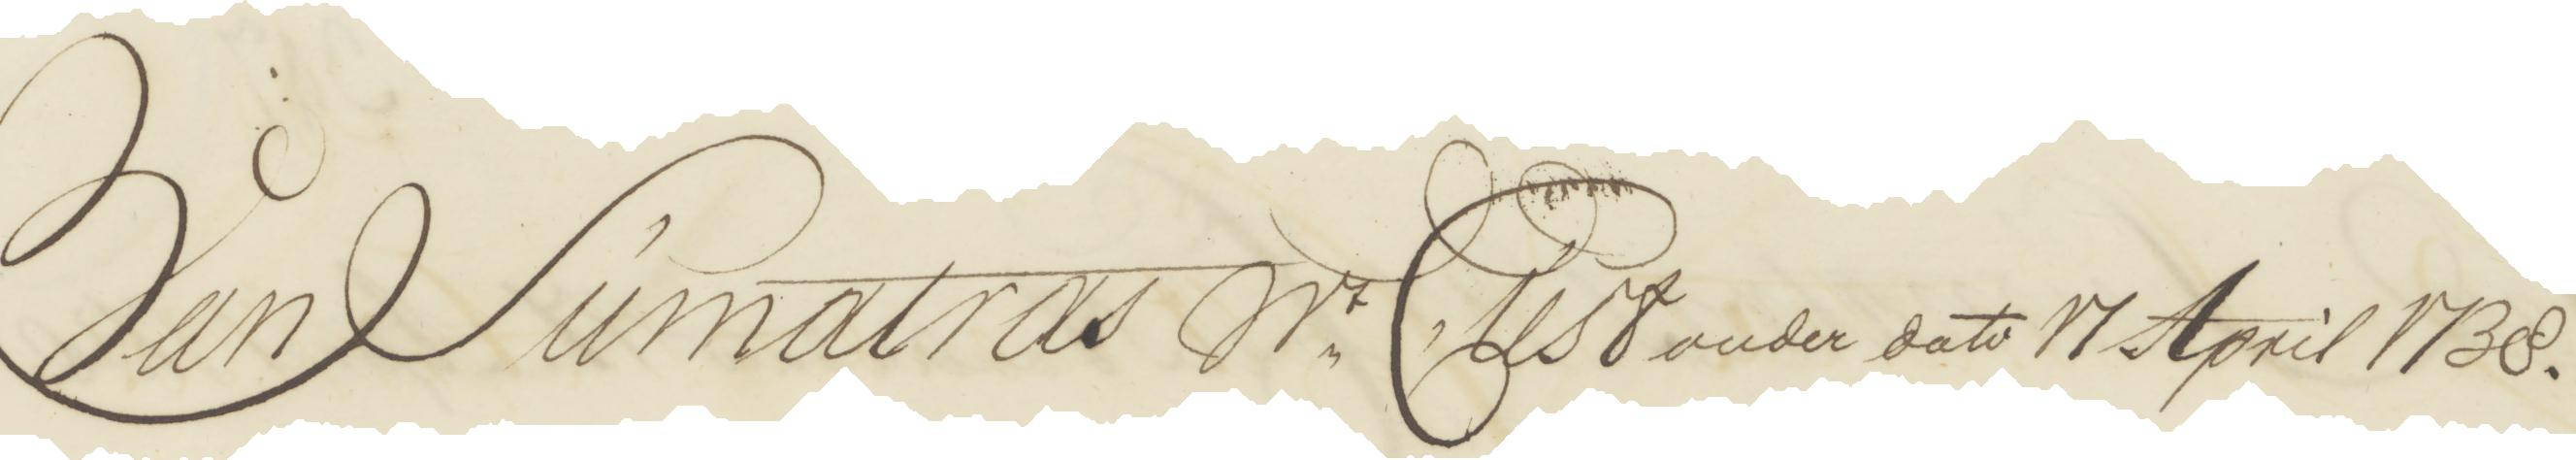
Van Sumatras W„t Cust onder dato 17 April 1738.
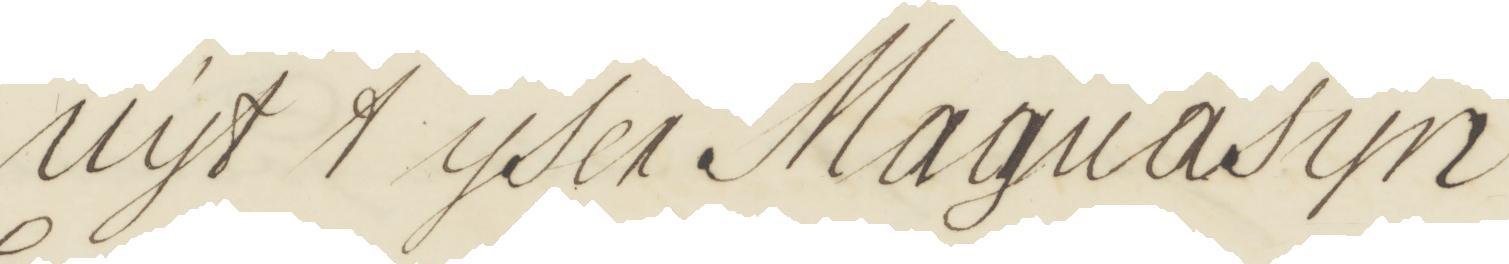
uijt 't ijser Maguasijn
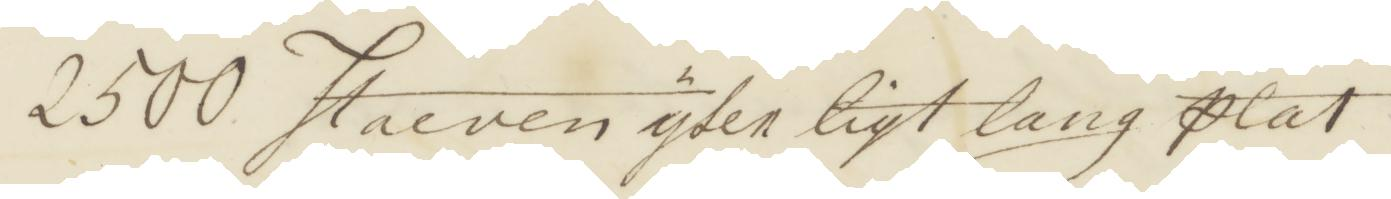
2500 staeven ijser ligt lang plat
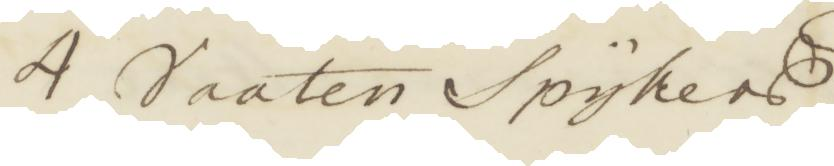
4 vaaten spijkers
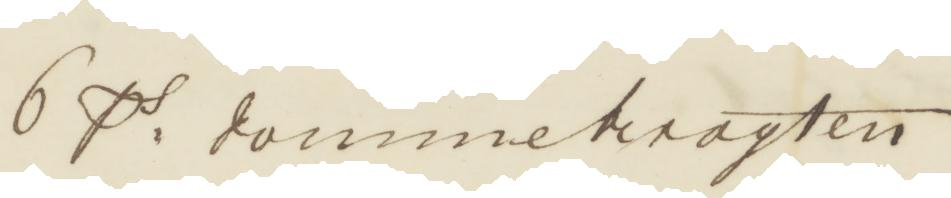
6 p„s dommekragten
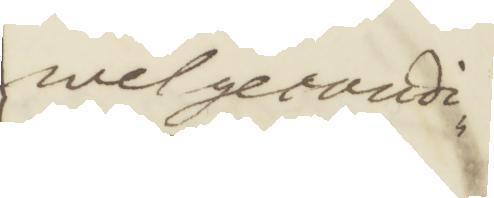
wel gecondi„
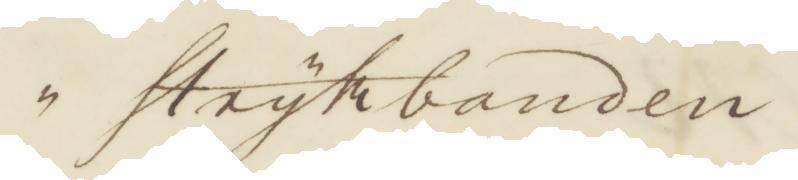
1 „ strijkbanden
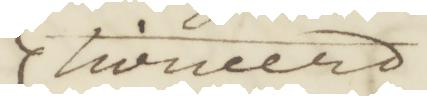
tioneerd
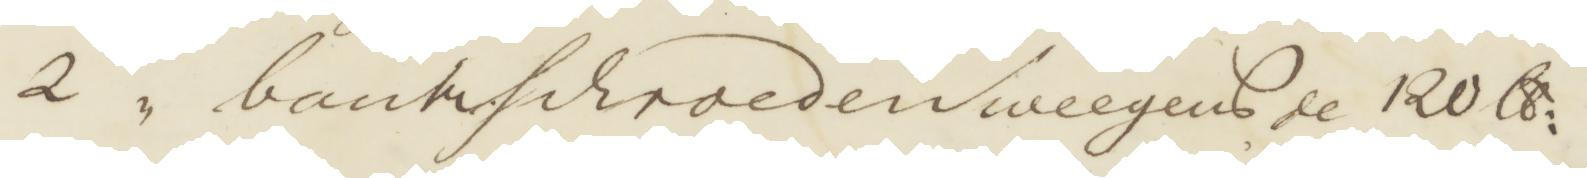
2 „ bankschroeden weegens de 120 lb:
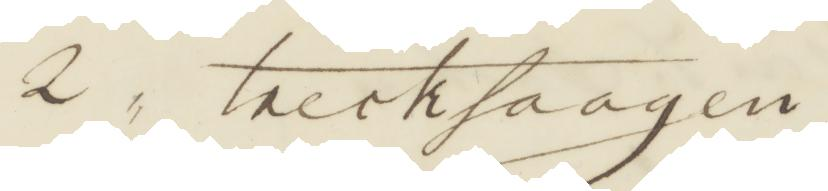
2 „ trecksaagen
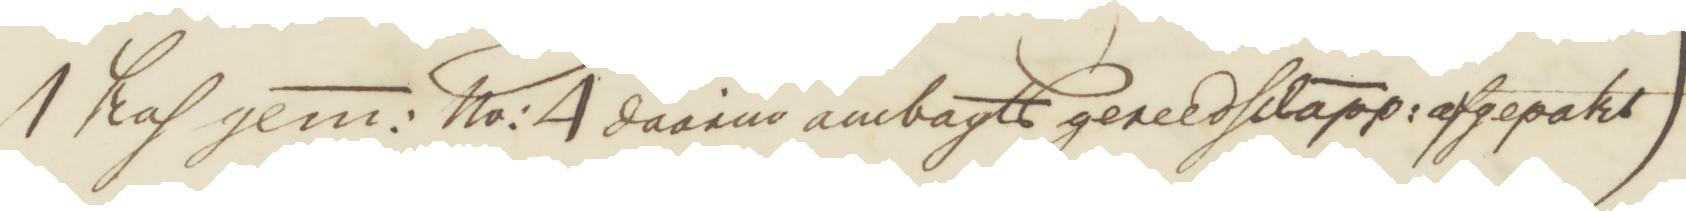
1 kaf gem: No: 4 daarin ambagts gereedschapp: afgepakt
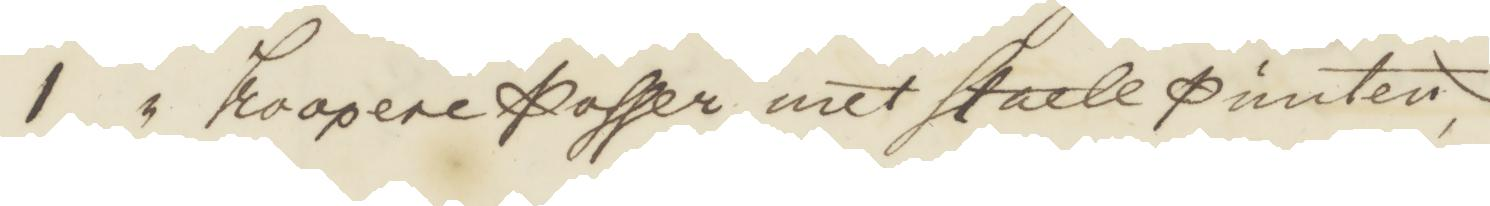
1 „ koopere passer met staele punten,
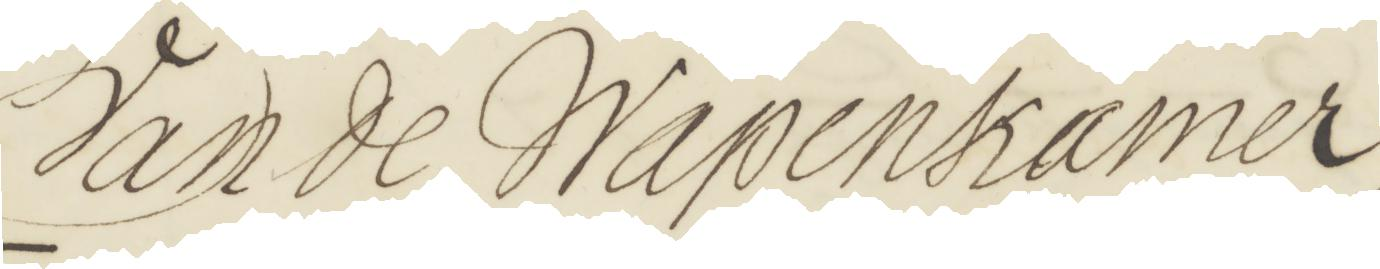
Van de wapenkamer
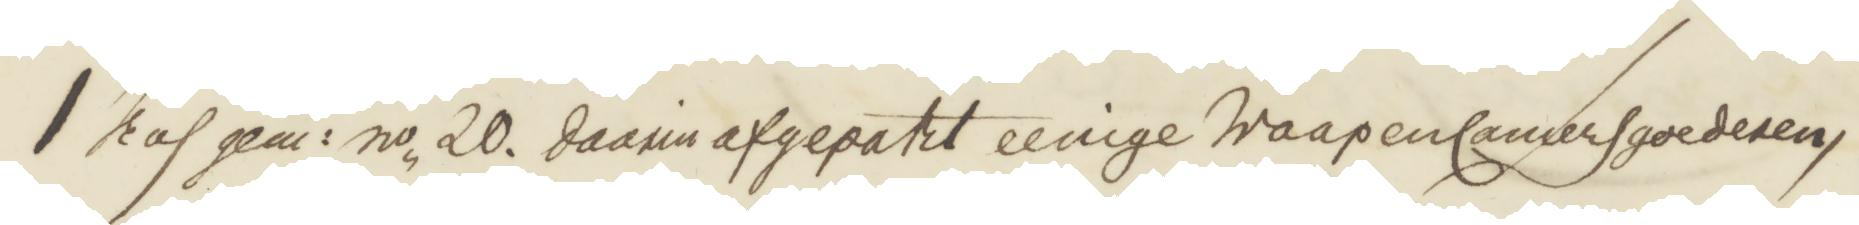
1 kaf gem: n„o 20. daarin afgepakt eenige waapencamers goederen,
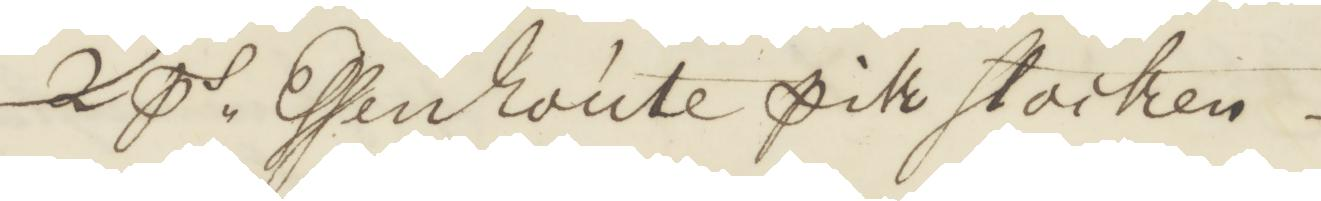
2 p„s Essenhoute pik stocken
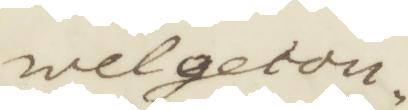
welgecon„
